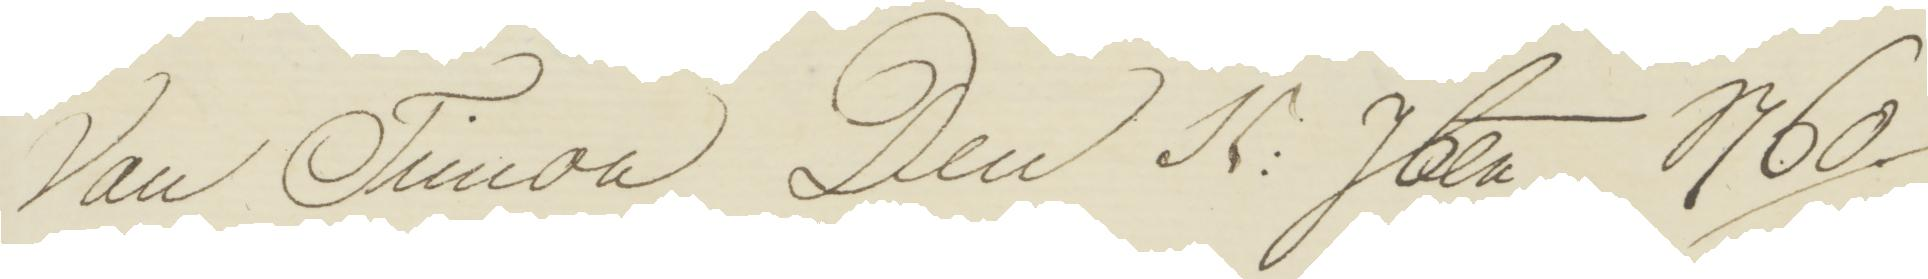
Van Timor Den 15: Jber 1768/
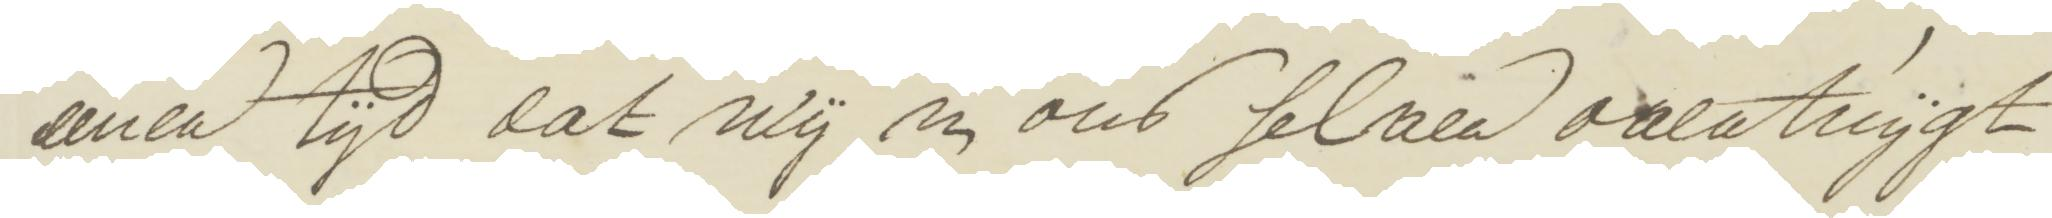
eener tijd dat wij in ons selver overtuijgt
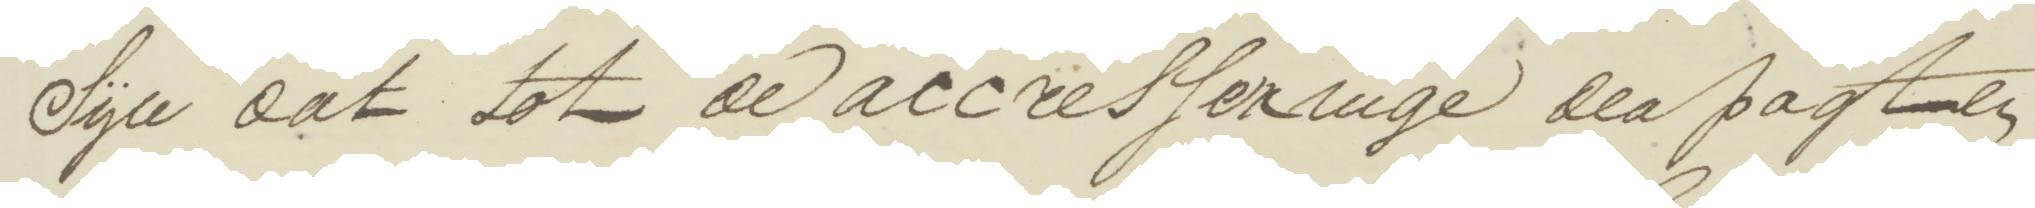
sijn dat tot de accresseringe der pagten
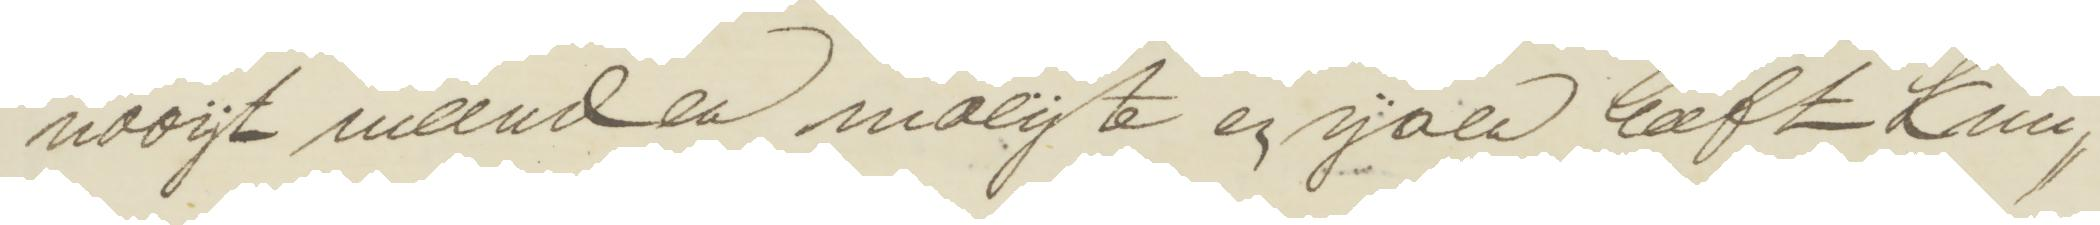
nooijt meerder moeijte en ijver heeft kun„
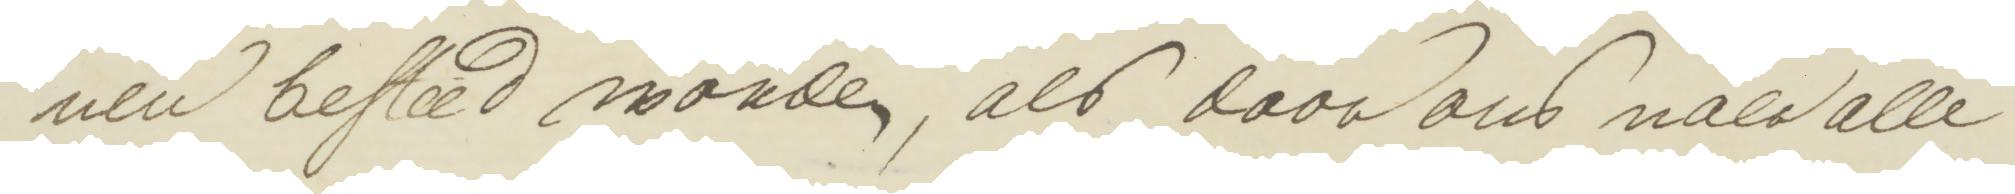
nen besteed worden, als door ons naer alle
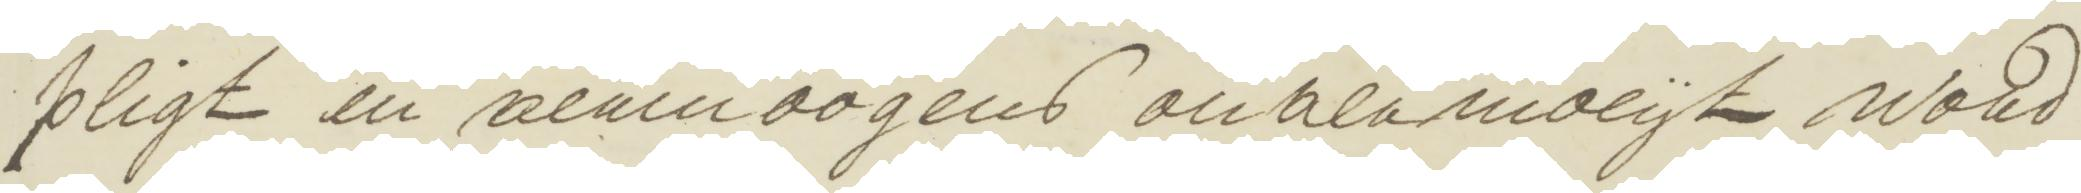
pligt en vermoogens onvermoeijt word
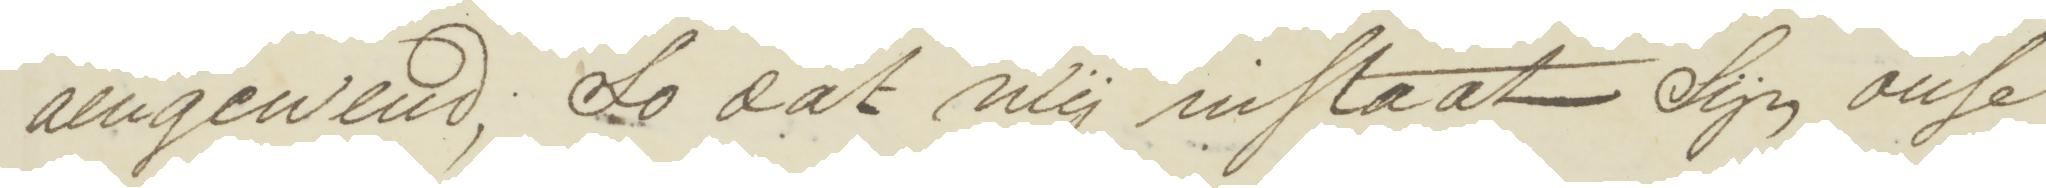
aengewend; so dat wij instaat sijn onse
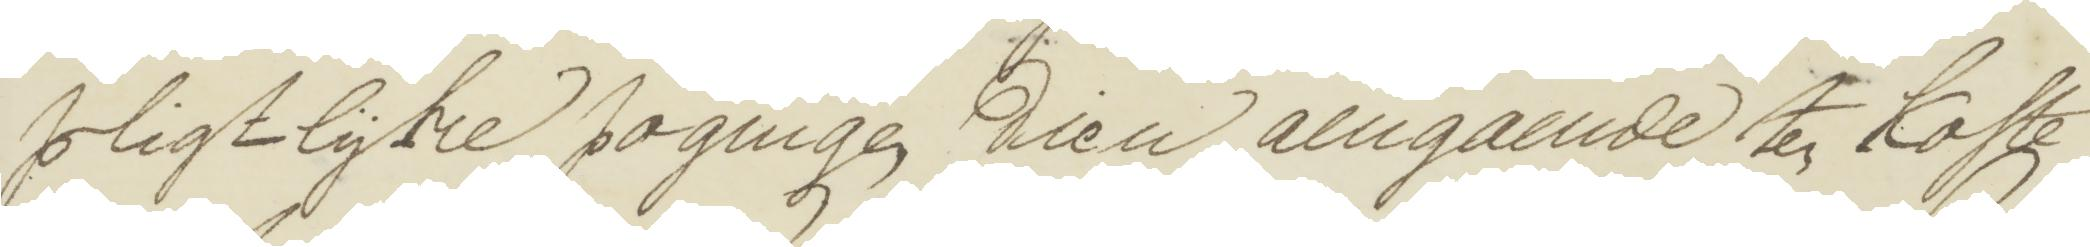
pligtlijke pogingen dien aengaende ten koste
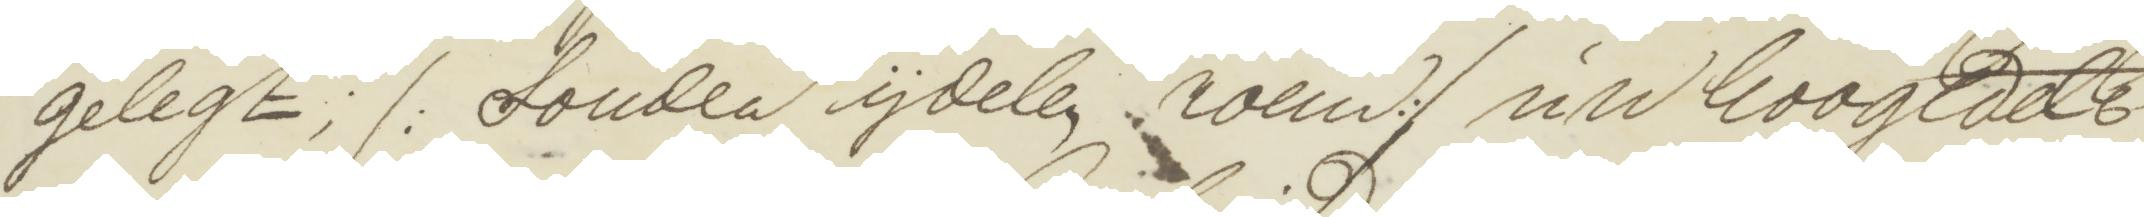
gelegt; /:sonder ijdelen roem:/ uw hoog Edelh
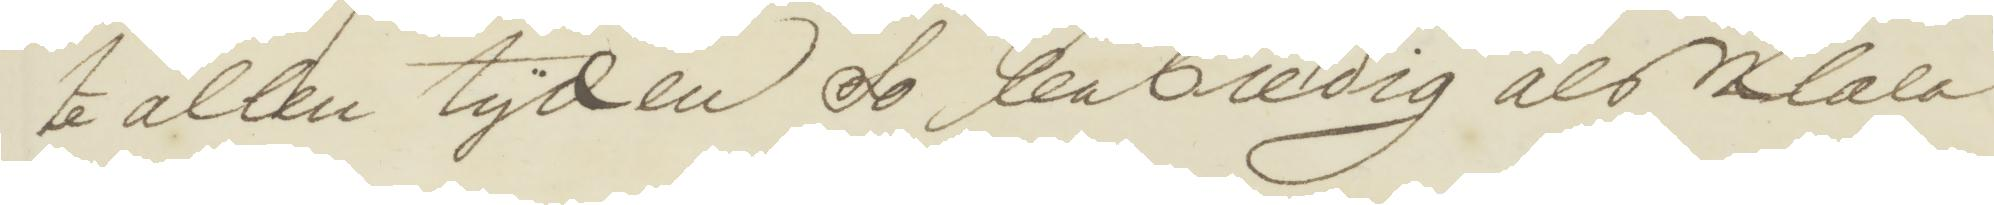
te allen tijden so Eerbiedig als Klaer
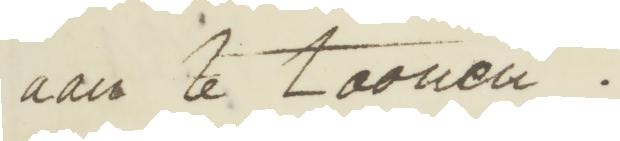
aan te toonen.
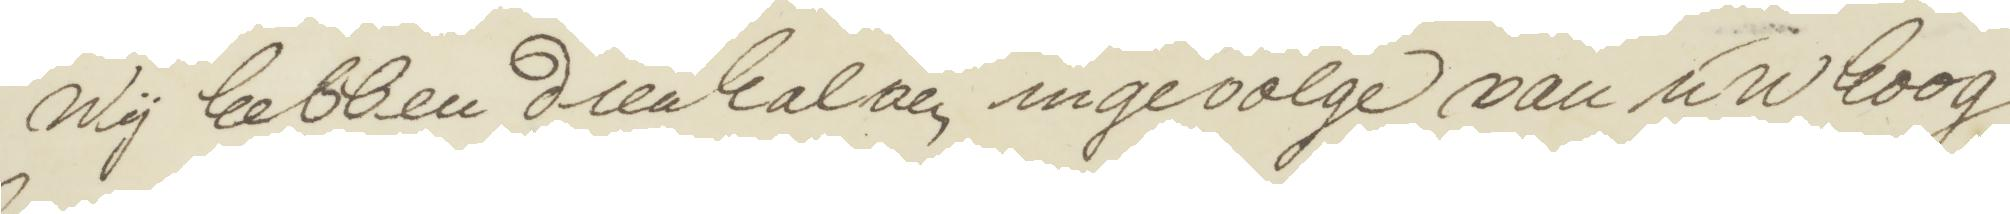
wij hebben dierhalven ingevolge van uw hoog
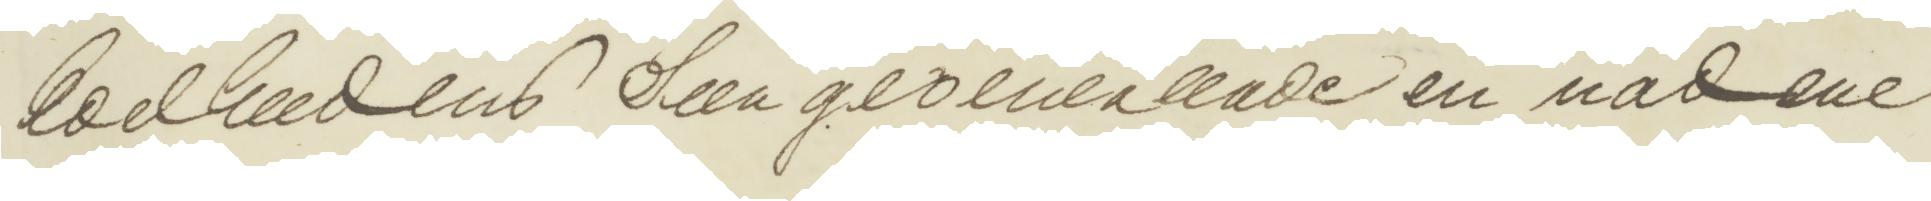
Edelheedens seer gevenereerde en nadere
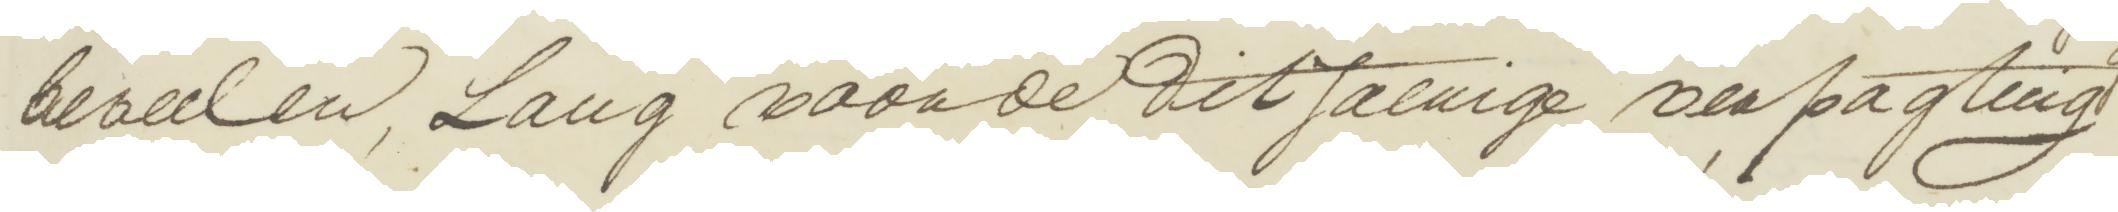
beveelen, lang voor de dit Jaerige verpagting
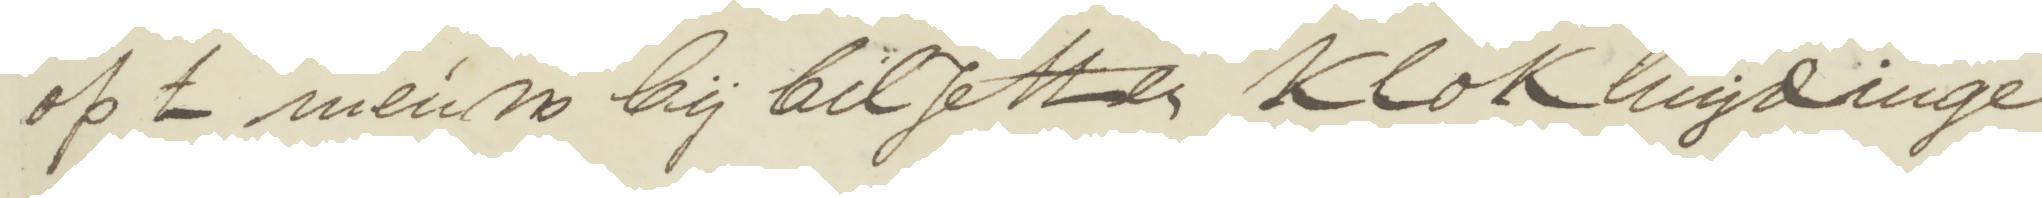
op t nieuw bij biljetten klokluijdinge
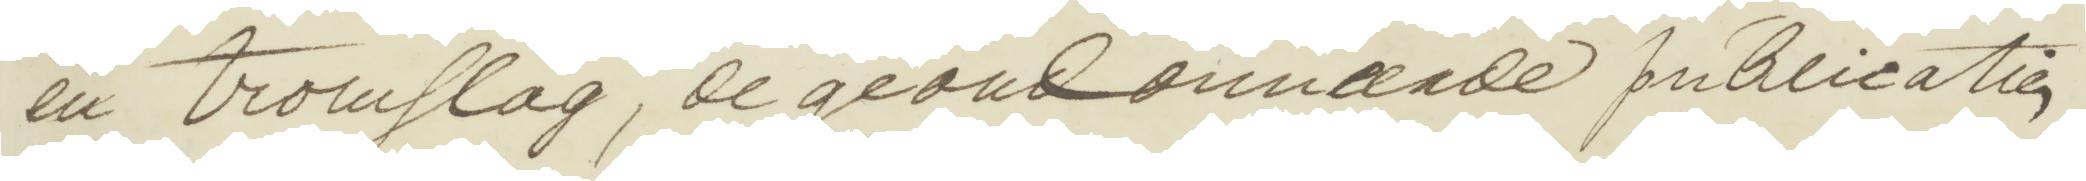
en tromslag, de geordonneerde publicatien
